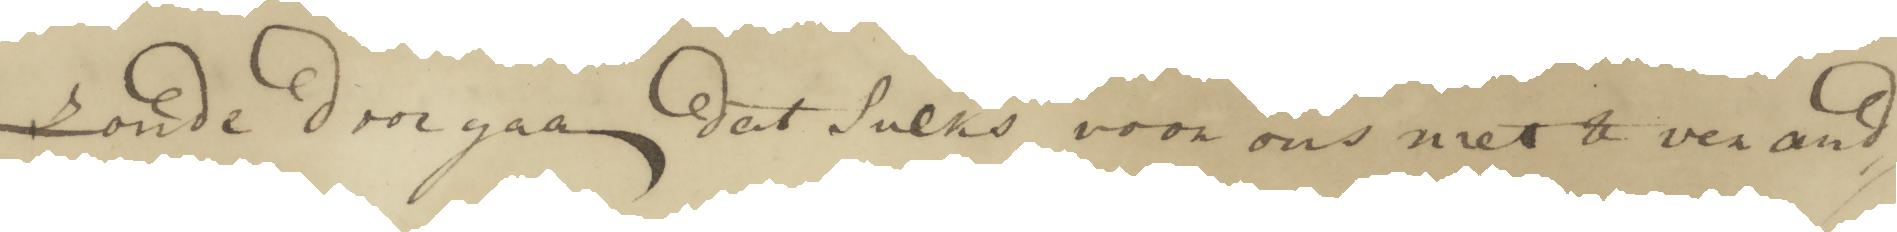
zoude door gaan dat sulks voor ons niet te verand„
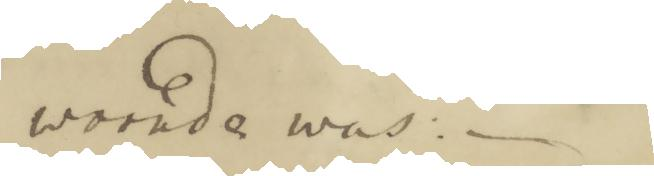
woorde was: —
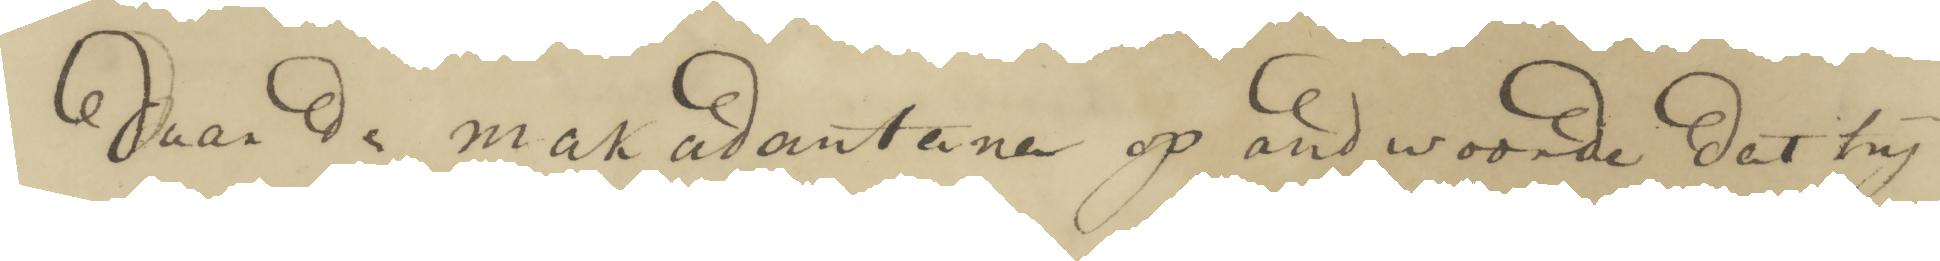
daar de makadantana op andwoorde dat hij
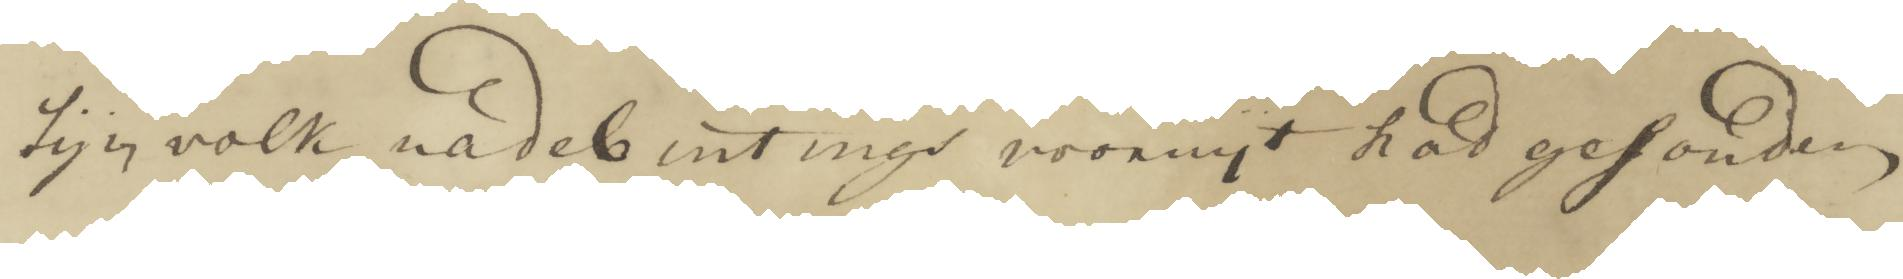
sijn volk na de bintings vooruijt had gesonden
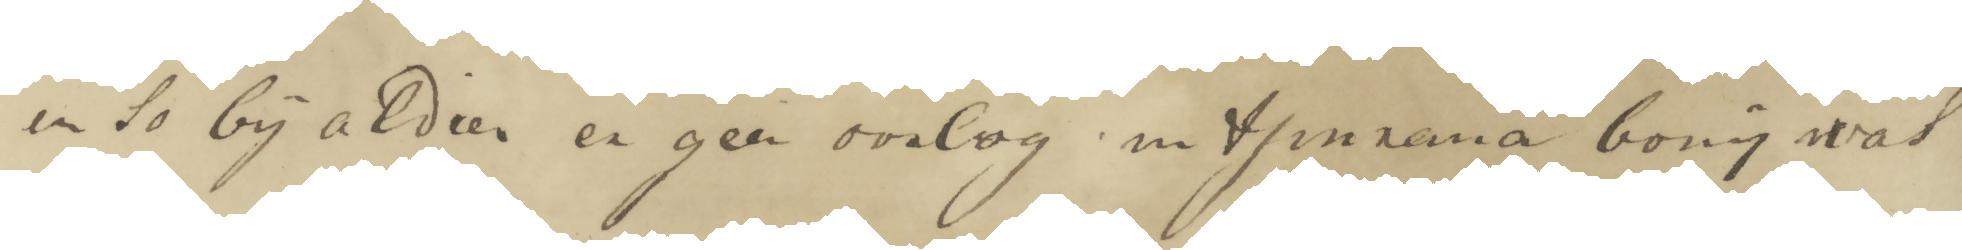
en so bij aldien er geen oorlog in tjinrama bonij was
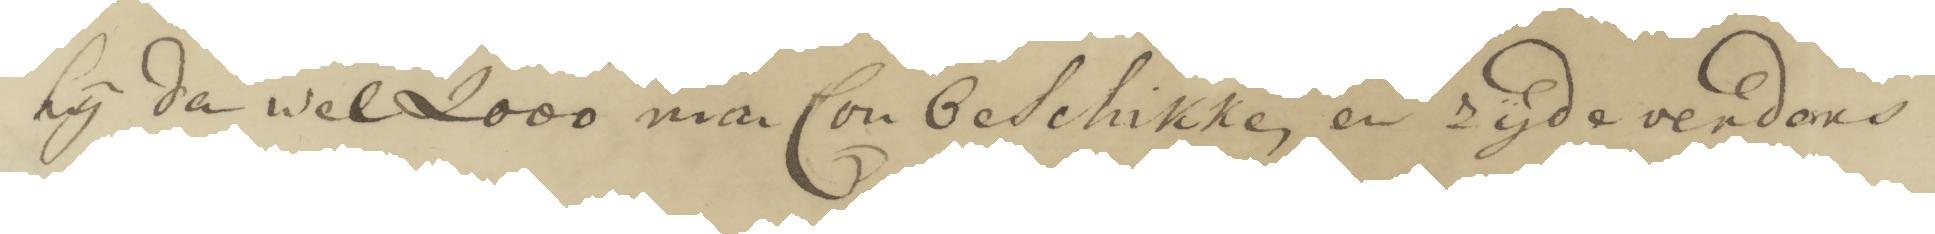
hij dan wel 2000 man Con beschikken en zijde verders
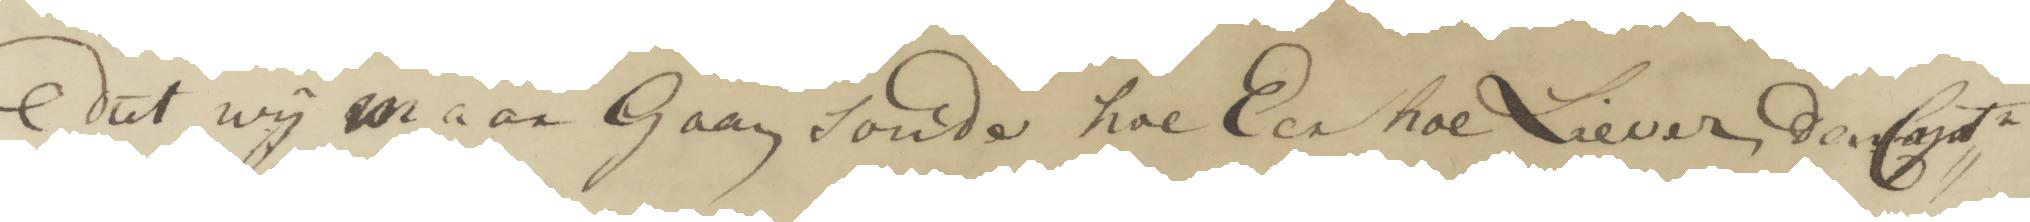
dat wij maar Gaan soude hoe Eer hoe Liever, den Capt„n
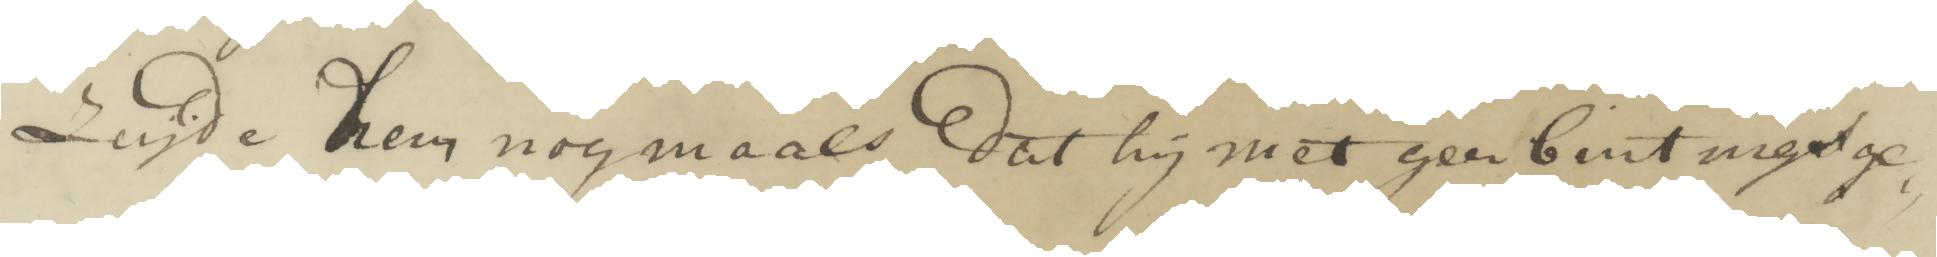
zeijde hem nogmaals dat hij met geen bintings ge„
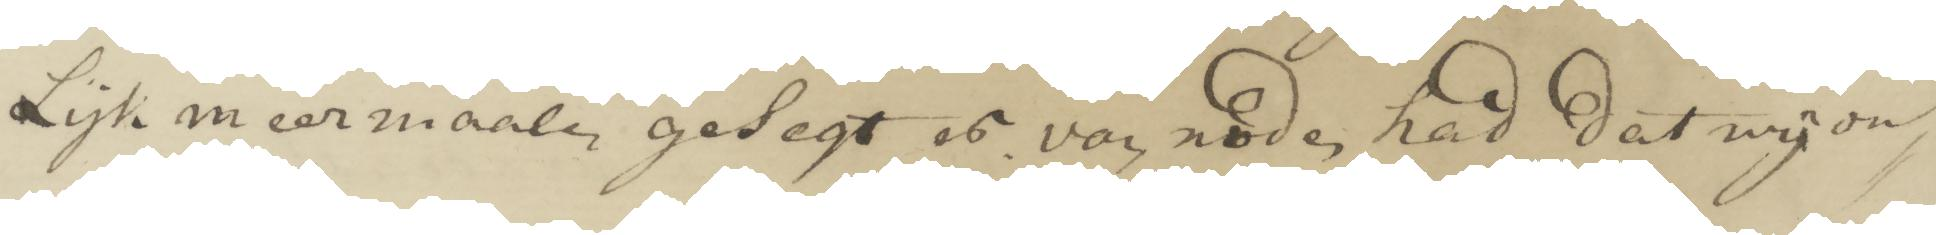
Lijk meermaalen gesegt es, van reden had dat wij on„
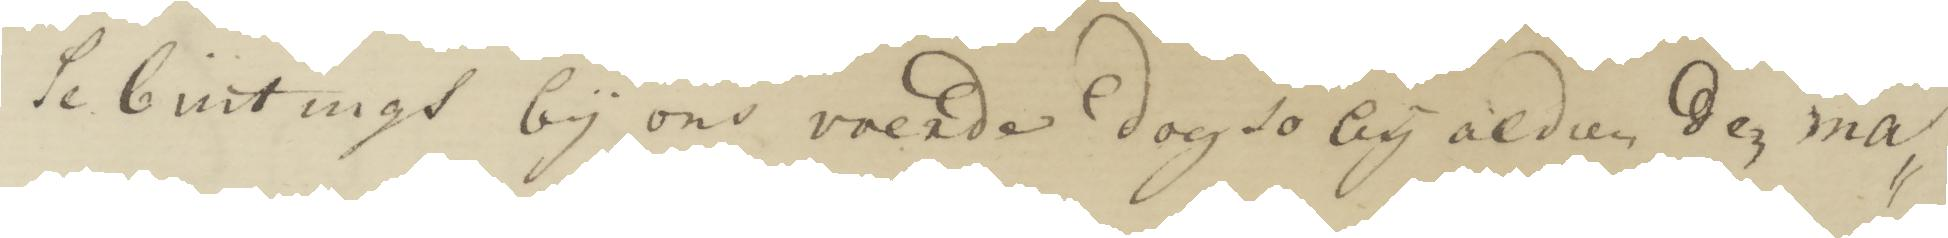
se bintings bij ons voerde dog so bij aldien den ma„
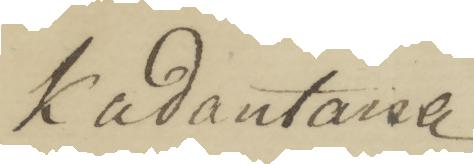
kadantana
